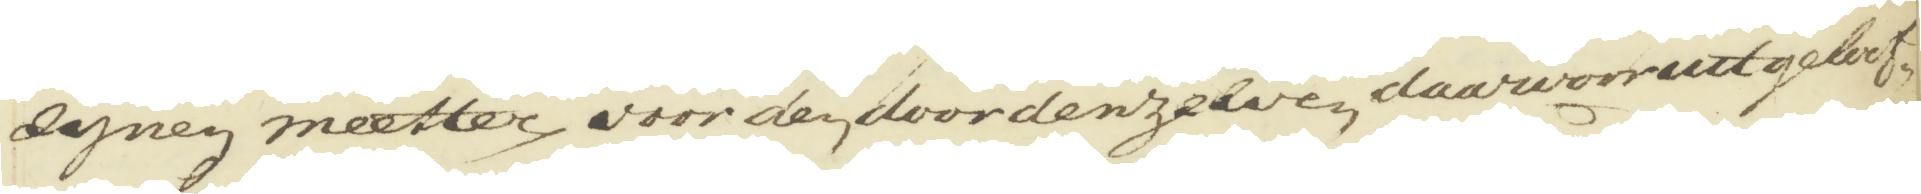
zynen meester voor den door denzelven daarvoor uitgeloof„
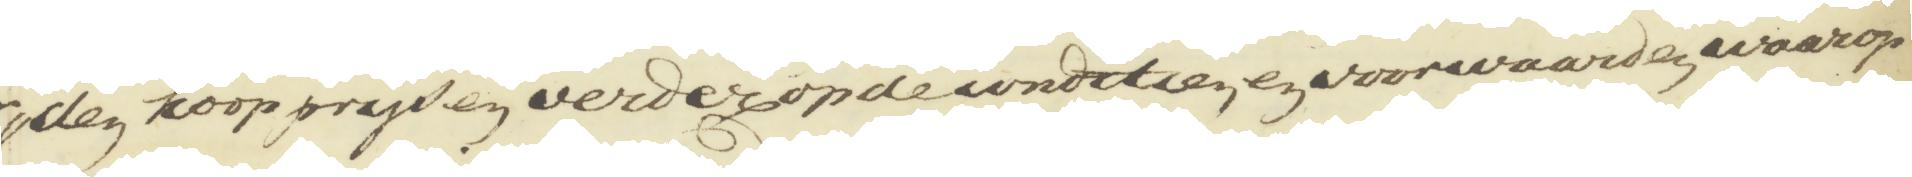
den koop prys en verder op de conditien en voorwaarden waarop
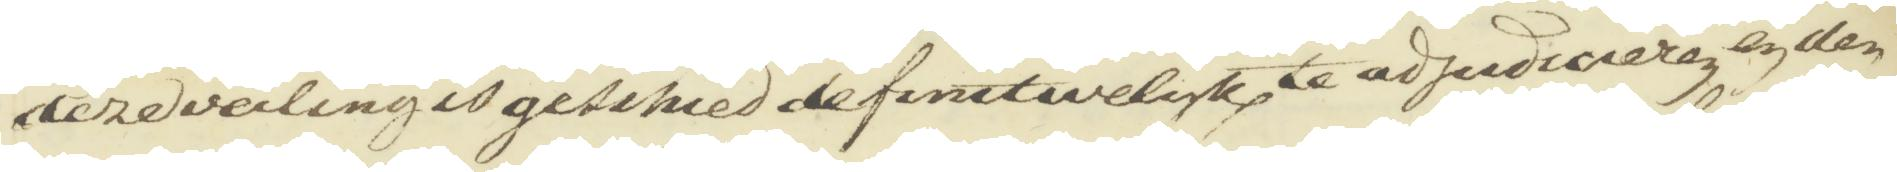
deze veiling is geschied definitivelyk te adjudicieren en den
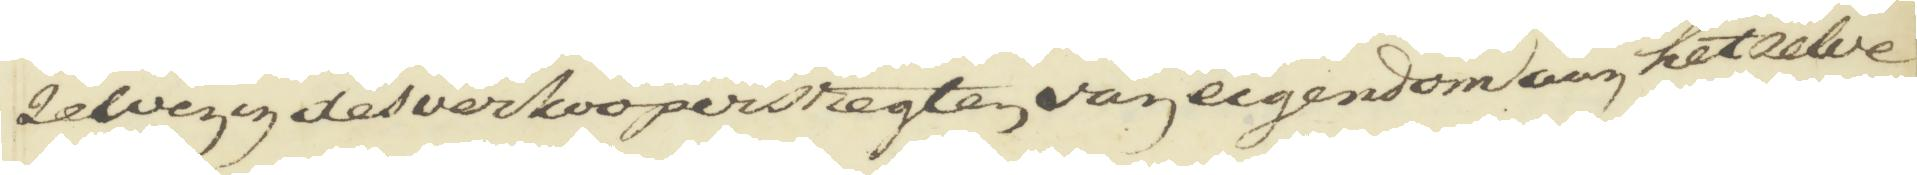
zelven in des verkoopers regten van eigendom aan het zelve
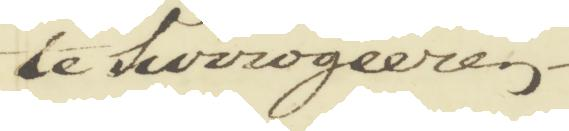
te surrogeeren —
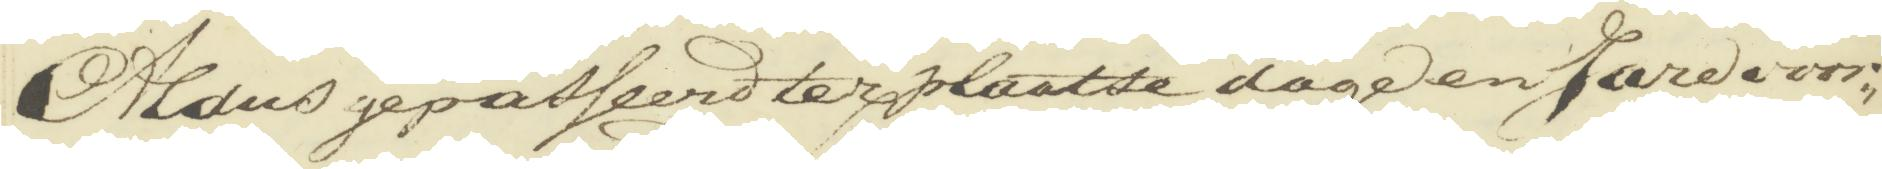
Aldus gepasseerd ter plaatse dage en Jare voor„
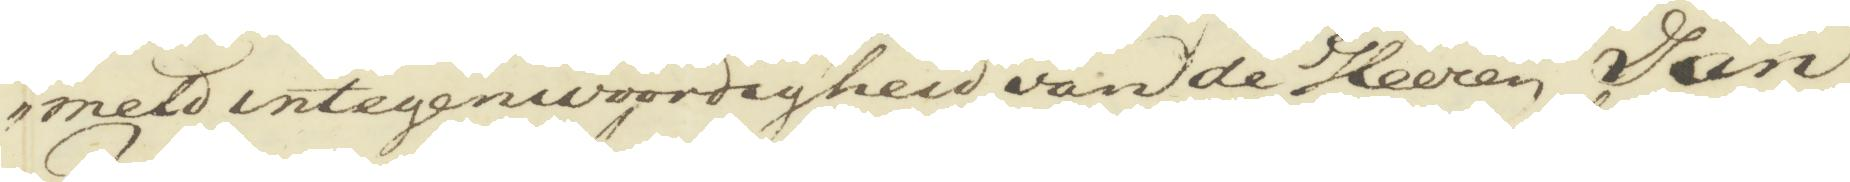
„meld integenwoordigheid van de Heeren Ian
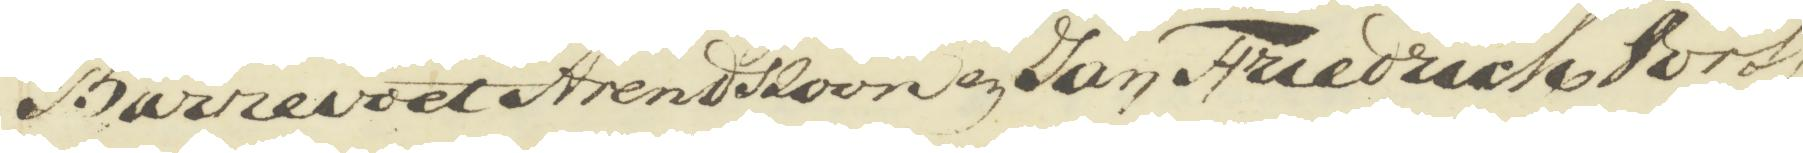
Barrevoet Arendszoon en Ian Friedrich Vorth
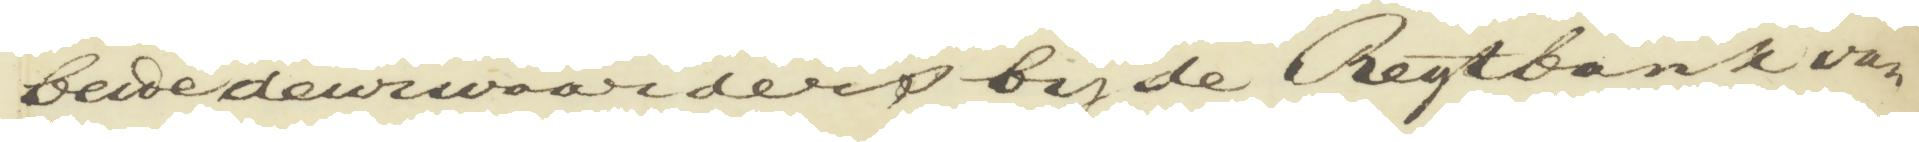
beide deurwaarders by de Regtbank van
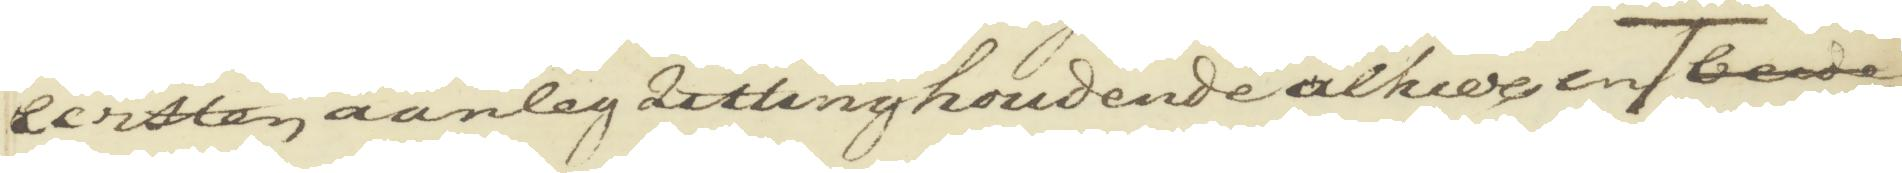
eersten aanleg zitting houdende alhier en T beide
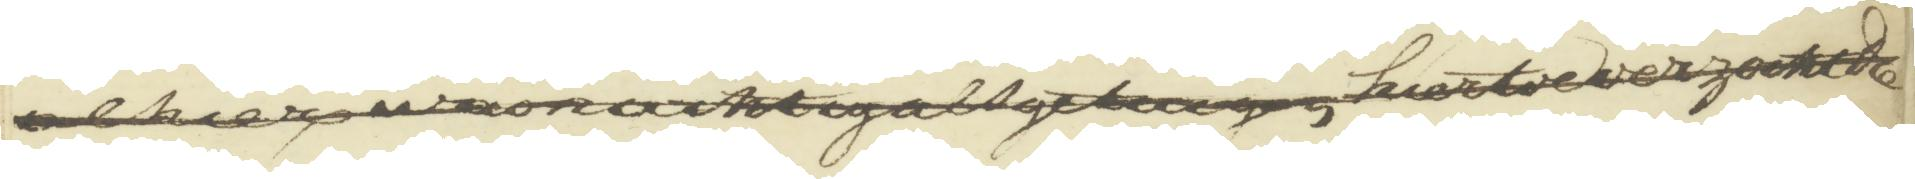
alhier woonachtig als getuigen hiertoe verzocht de
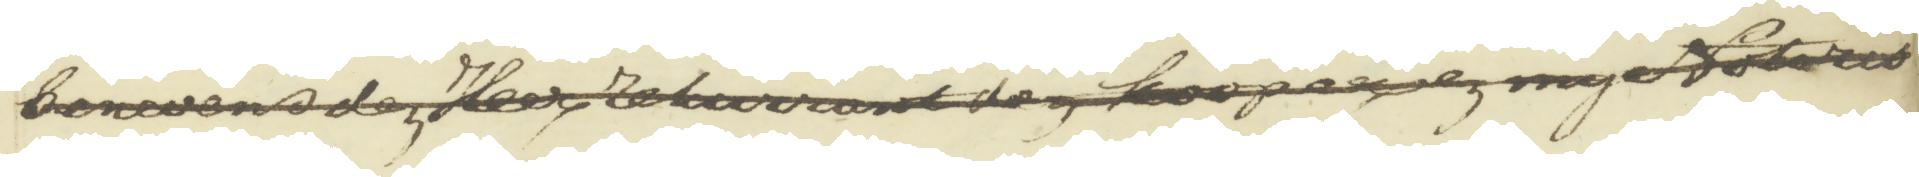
benevens den Heer rekurrant den kooper en my Notaris
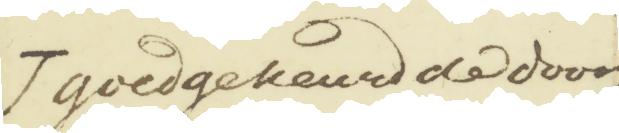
T goedgekeurd de door
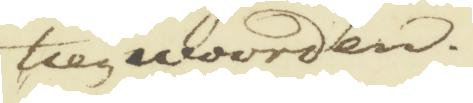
„tien woorden.
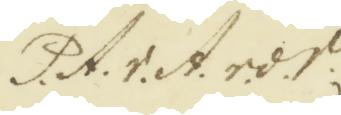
P.A. v. A. v. e. V.
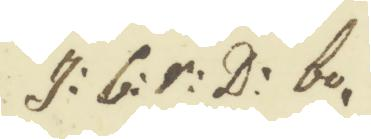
J:C: v: D: be.
